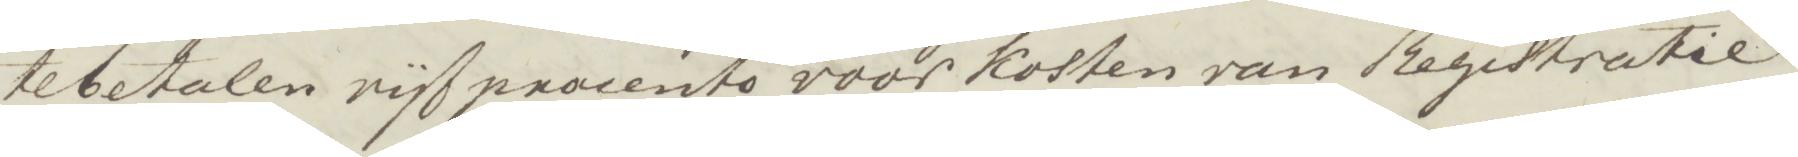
te betalen vijf procento voor kosten van Registratie
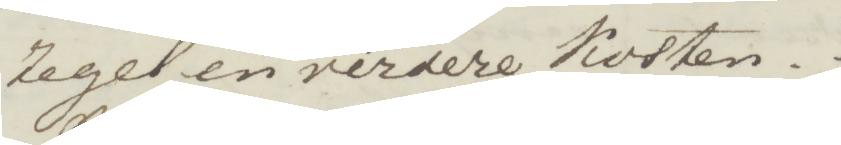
zegel en verdere Kosten. -
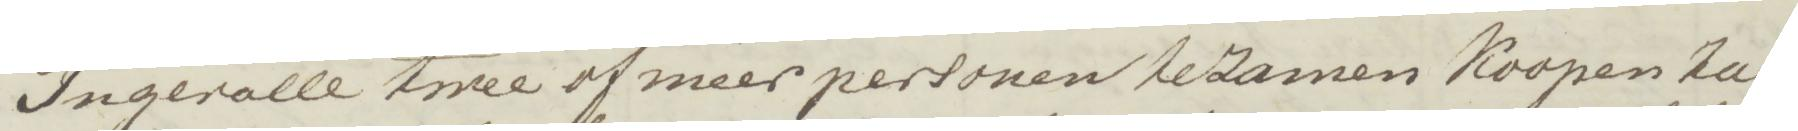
Ingevalle twee of meer personen tezamen Koopen zal
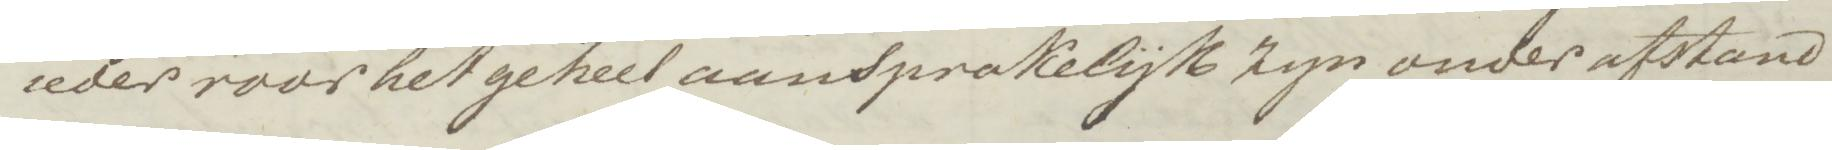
ieder voor het geheel aansprakelijk zyn onder afstand
